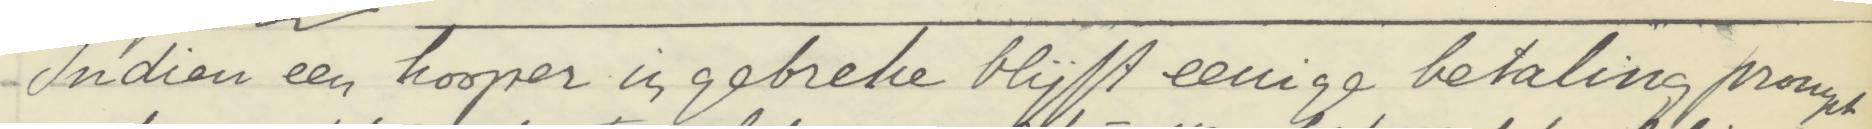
Indien een koper in gebreke blijft eenige betaling, prompt
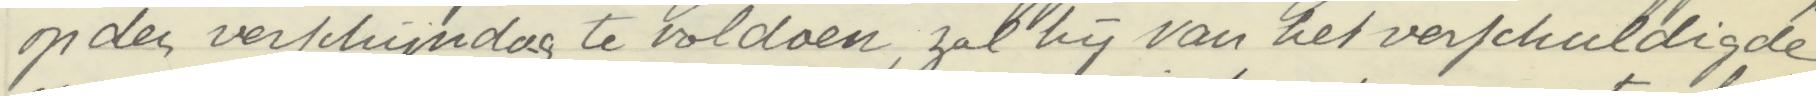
op den verschijndag te voldoen, zal hij van het verschuldigde
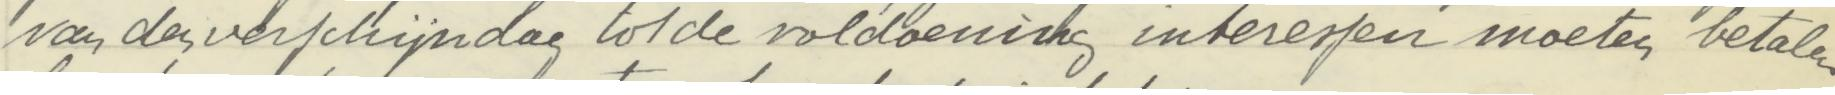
van den verschijndag tot de voldoening interessen moeten betalen
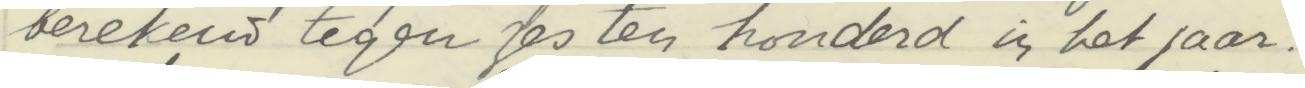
berekend tegen zes ten honderd in het jaar.
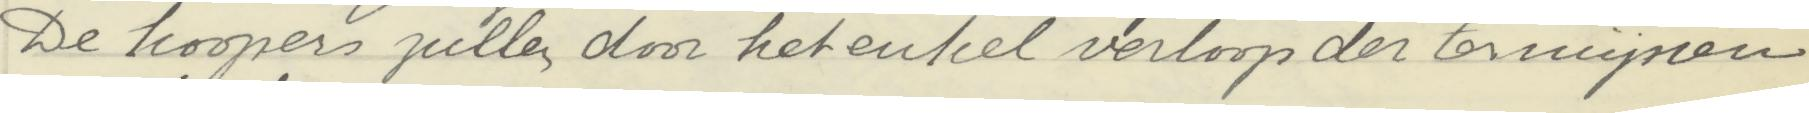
De koopers zullen door het enkel verloop der termijnen
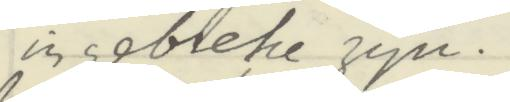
in gebreke zijn.
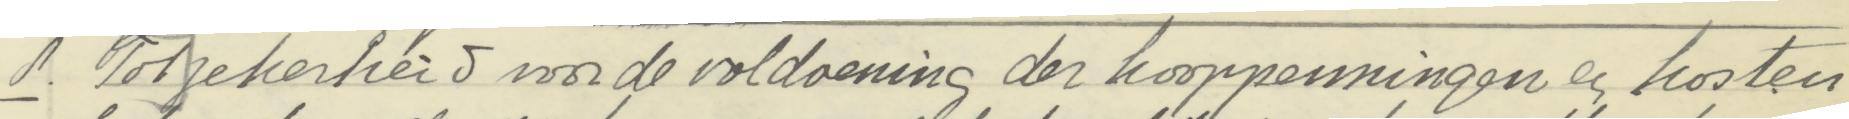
8. Tot zekerheid voor de voldoening der kooppenningen en kosten
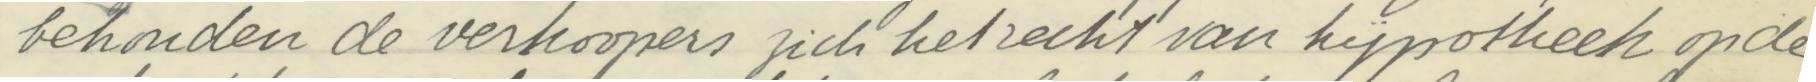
behouden de verkoopers zich het recht van hijpotheek op de
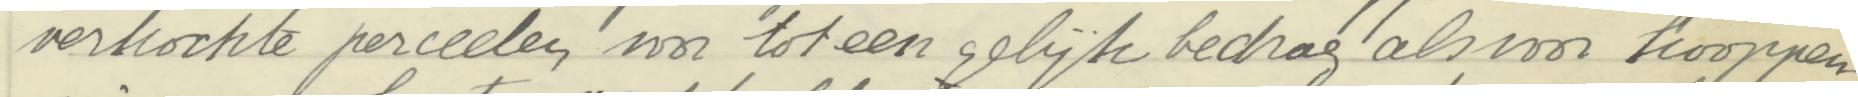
verkochte perceelen voor tot een gelijk bedrag als voor kooppen
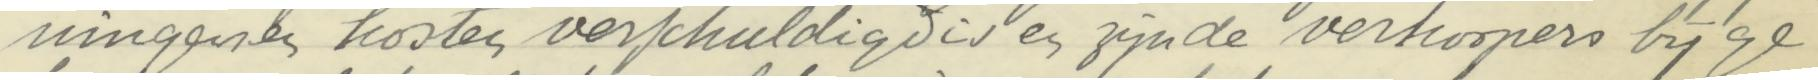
ningenen kosten verschuldigd is en zijnde verkoopers bij ge
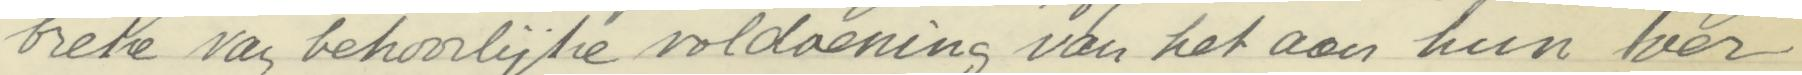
breke van behoorlijke voldoening van het aan hun ver
